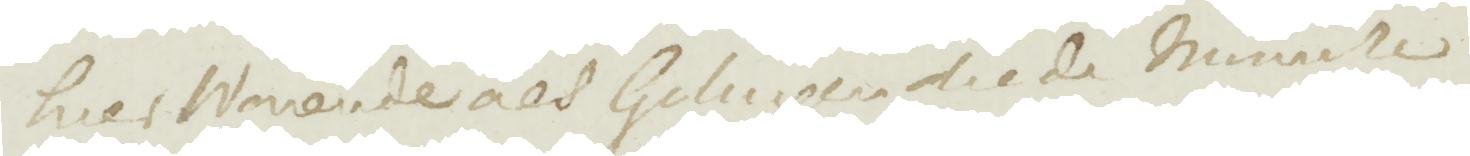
hier wonende als getuigen, die de minute
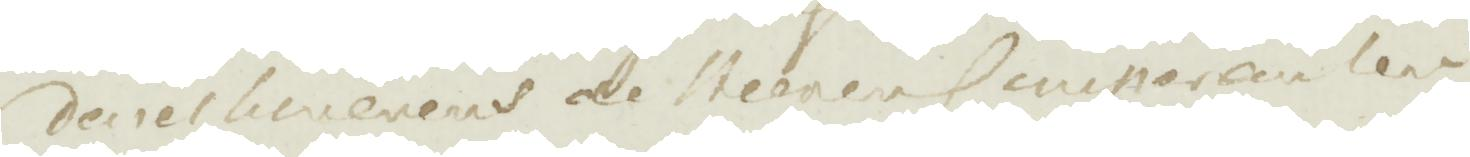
dezes, benevens de Heeren Comparanten
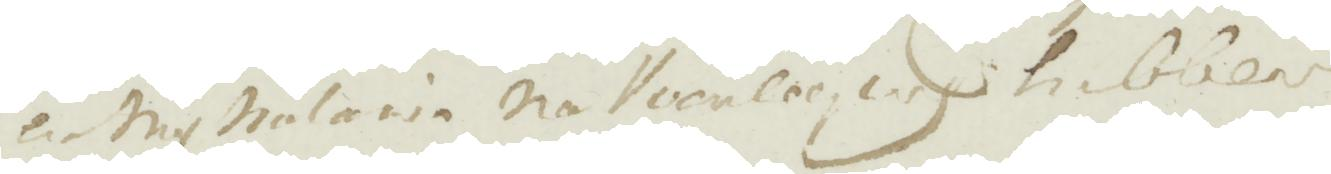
en my notaris na Voorlezing hebben
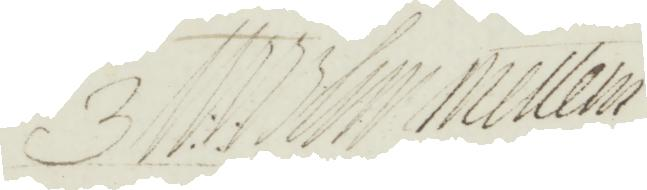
MJ van Mellem
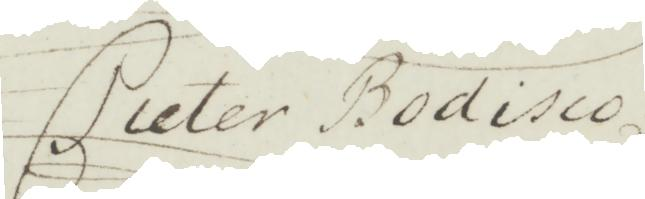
Pieter Bodisco
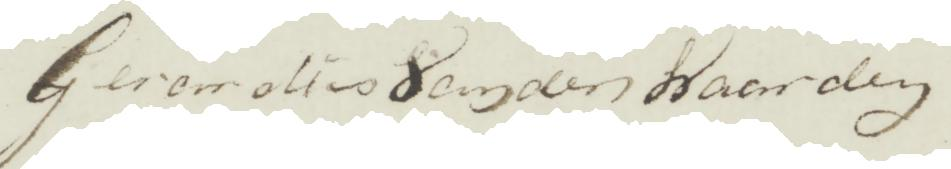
Gerardus Vander Waarden
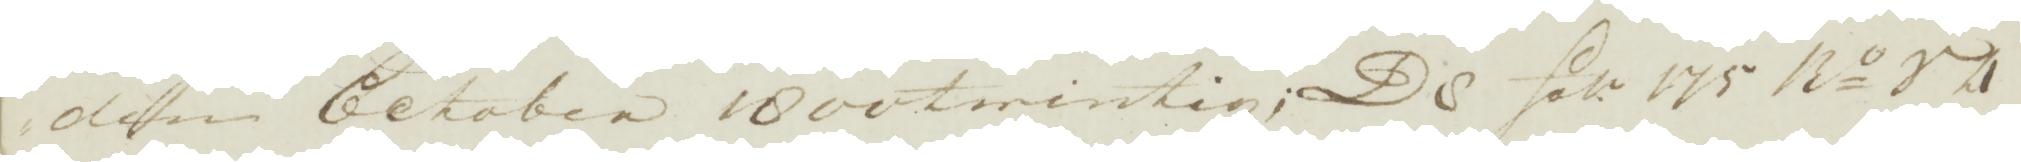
,,den October 1800twintig; D8 fol.o 175 N=o V4
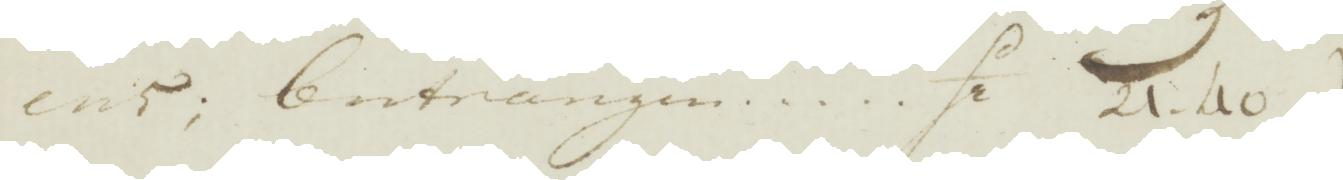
en 5; Ontvangen.....ƒr 21.40
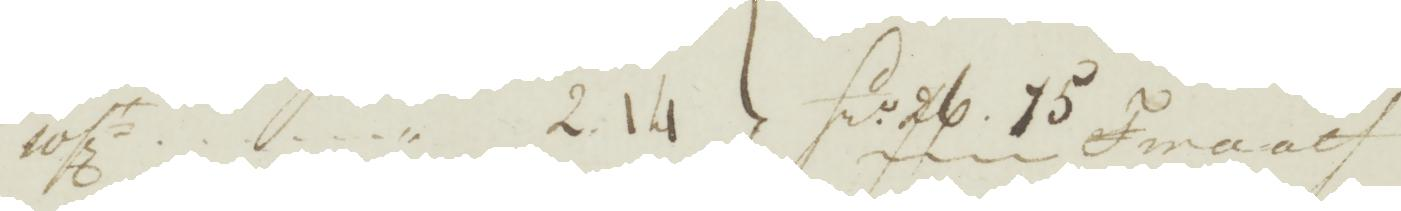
10pr=t - - - - - - - ,, 2.14 rx.26.75 Twaalf
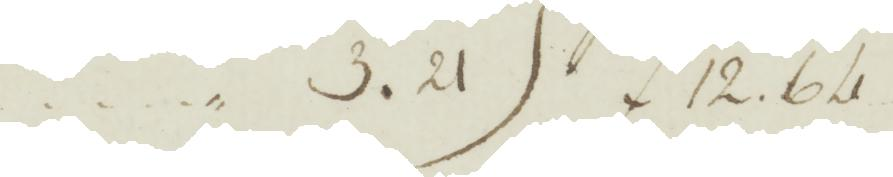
- - - - - - ,, 3.21 ƒ.12.64
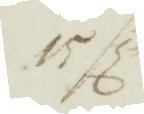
15 pr=t
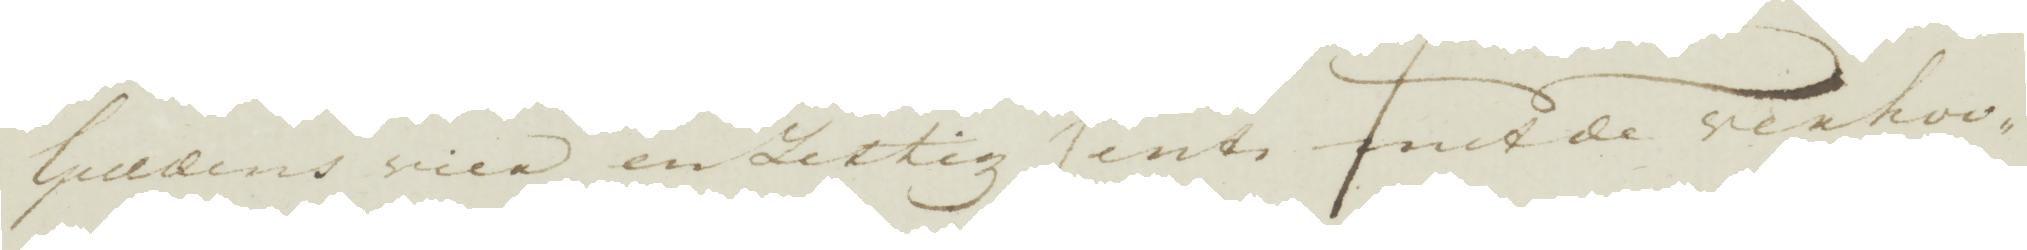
Guldens vier en zestig Cent met de verhoo,,
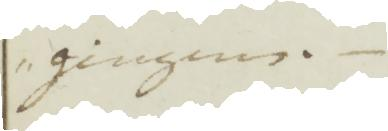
,,gingen. —
